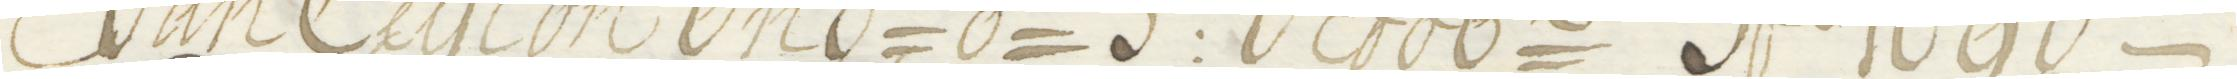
Van Ceijlon Ond=r d=to 5:' Octob=r Ao 1690 —
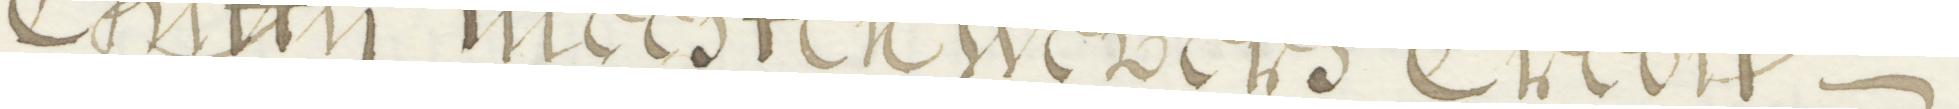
Chittij meester wevers Credit —
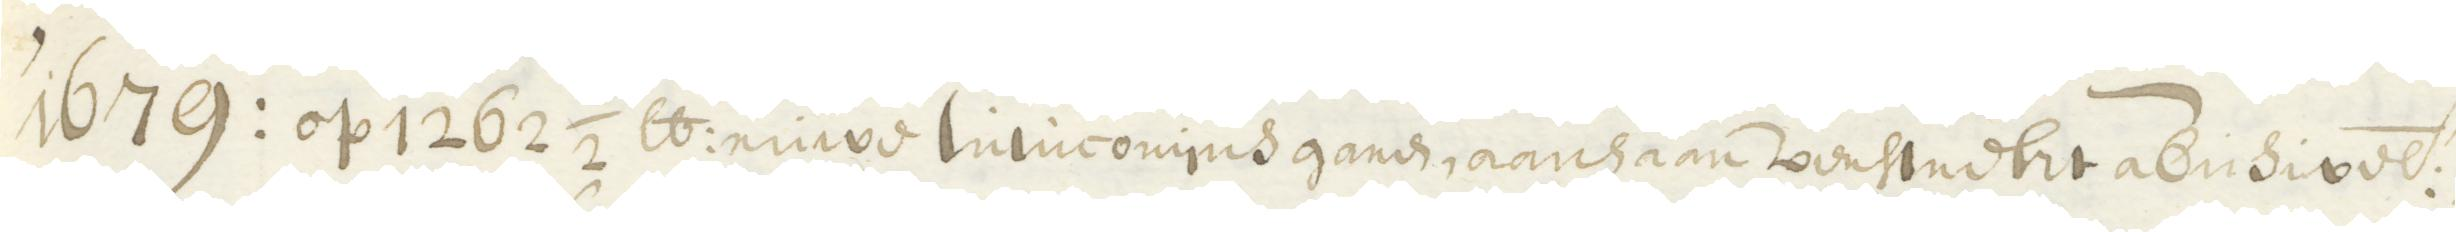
'1679': op 1262½ lb: ruwe tutucorijns garen, aanhaar verstrekt abusivelijk
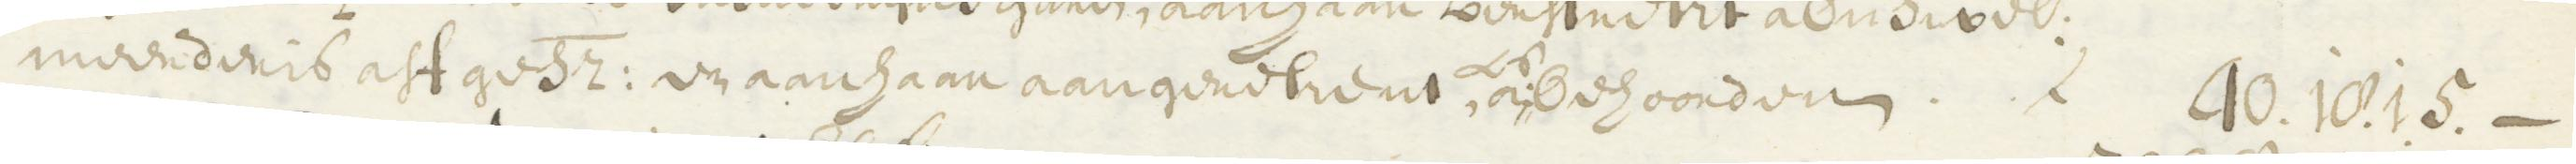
meerderis aff gesz: en aanhaar aangerekent, on:s behoorden ƒ 40. 18.15. —
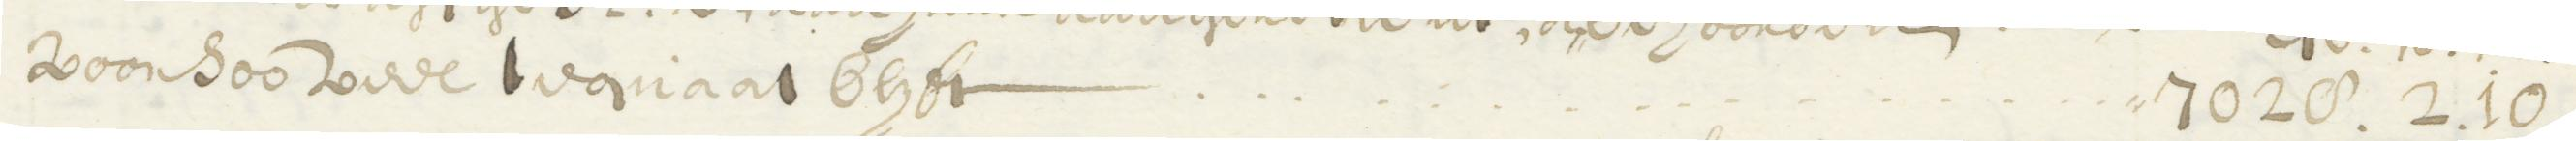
voorsoo veel tequaat blyft - - - - - - - - - - - - - - - - „ 7028. 2.10.
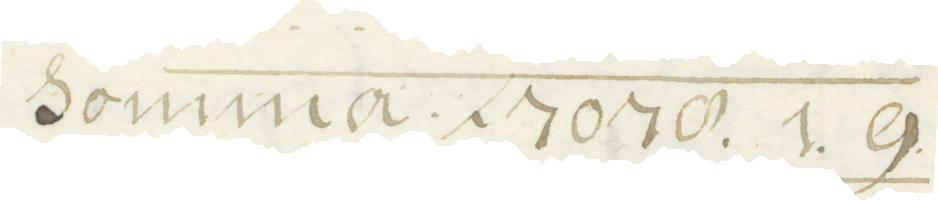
Somma: ƒ 7078. 1. 9.
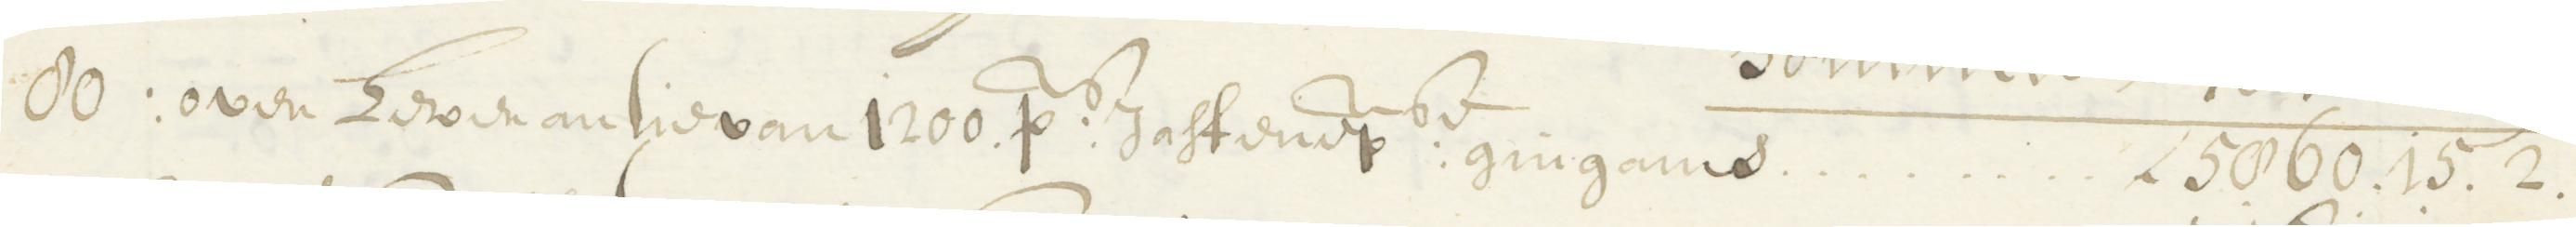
80: over leverantie van 1200. p:s Jaffenep:se gingams - - - - - - - - ƒ 5860.15. 2.
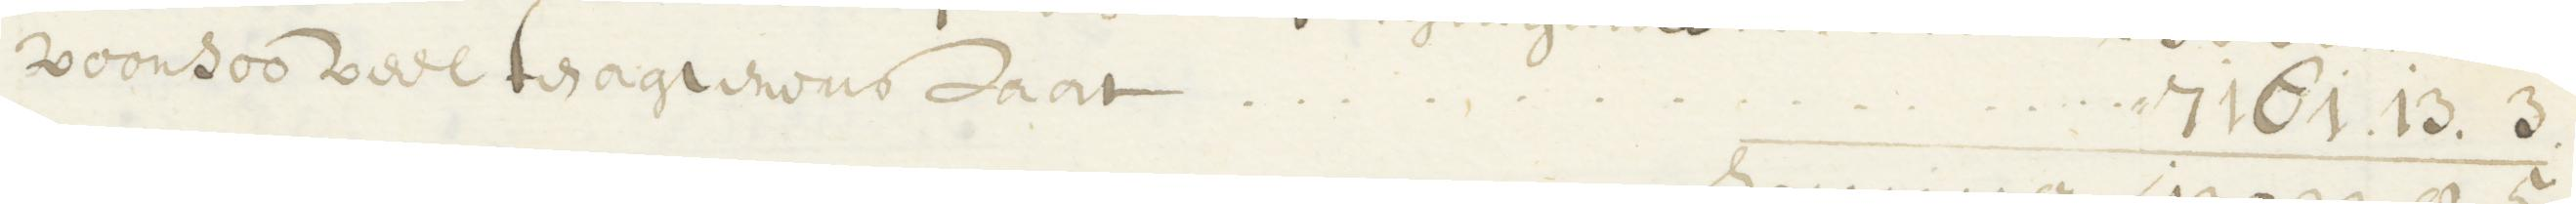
voorsoo veel ten agterenstaat - - - - - - - - - - - - - - „ 7181.13. 3.
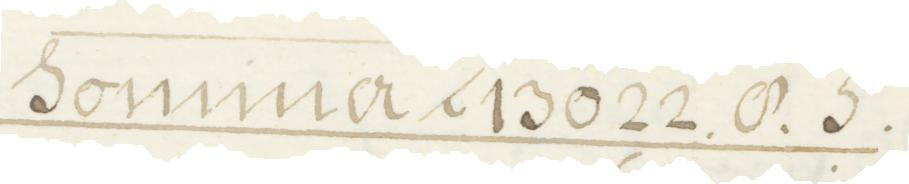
Somma ƒ 13022. 8. 5.
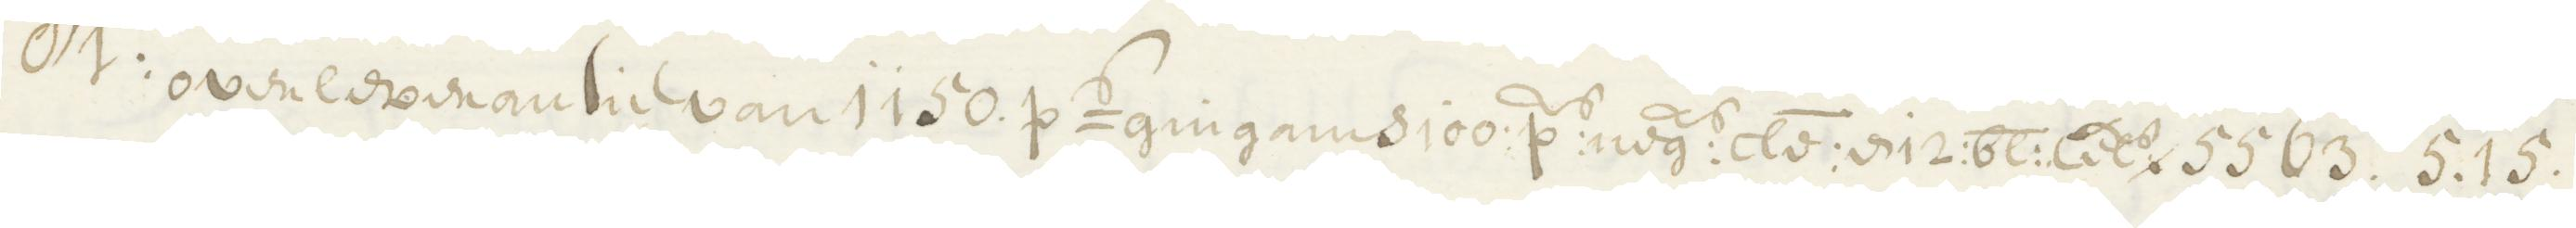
81: over leverantie van 1150. p=s gingams 100: p:s neg:s cle: en 12: bl: Cel.s ƒ 5563. 5.15.
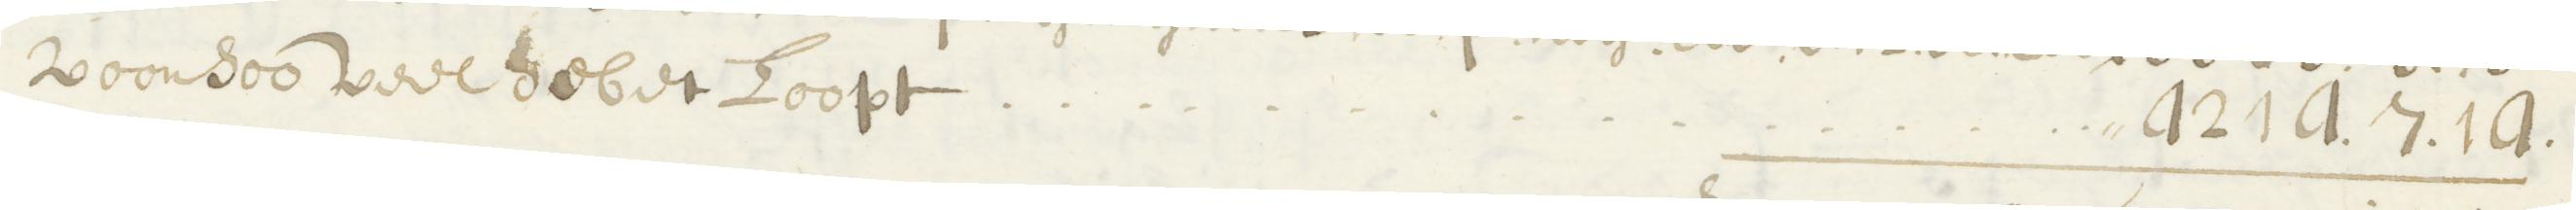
voorsoo veel debet loopt - - - - - - - - - - - - - - - - „ 4214. 7.14.
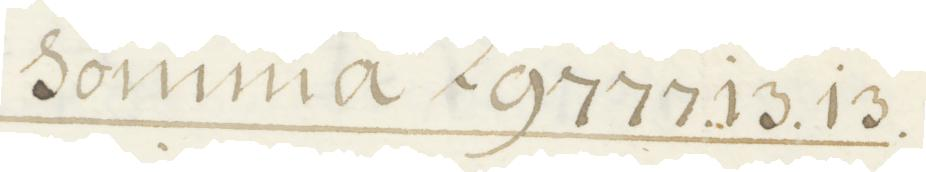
Somma ƒ 9777.13.13.
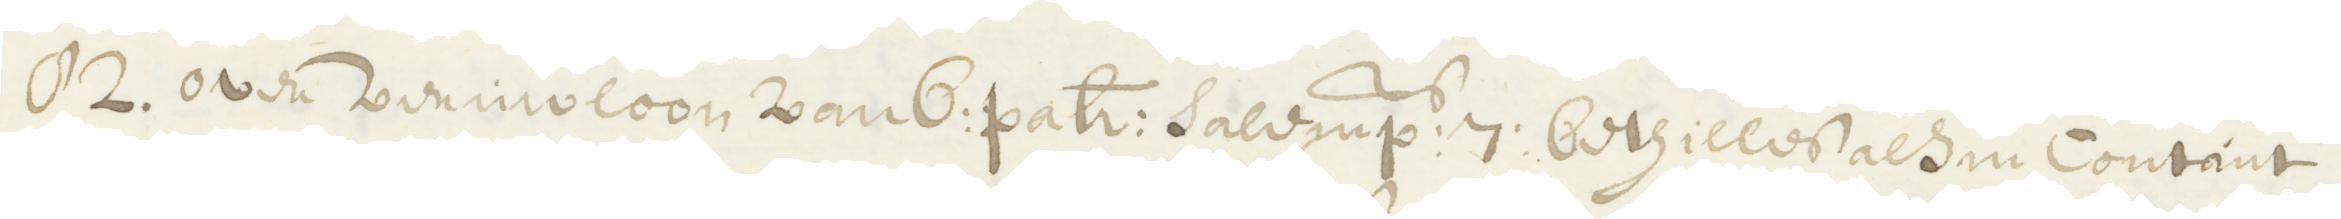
82. over veruwloon van 6: pak: salemp:s 7: bethilles als in Contant
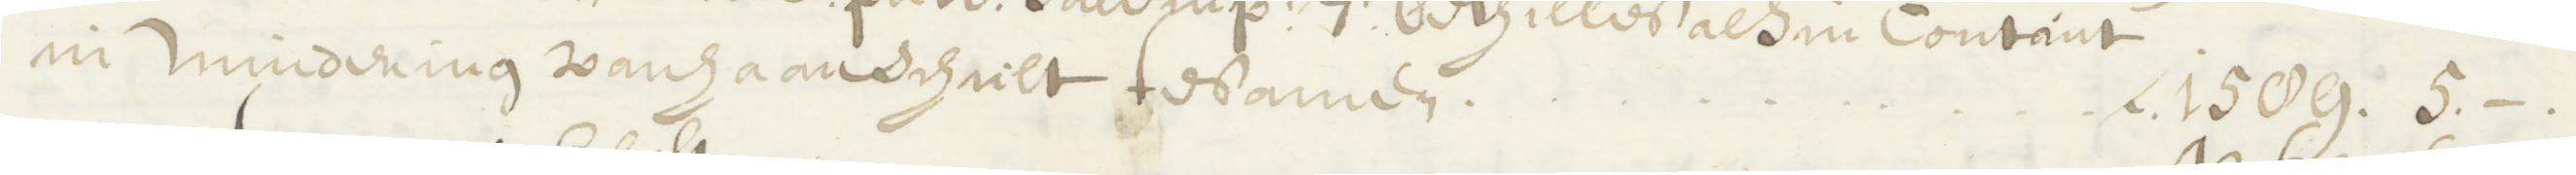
in mindering vanhaar schult tesamen - - - - - - - - - - ƒ 1589. 5. —.
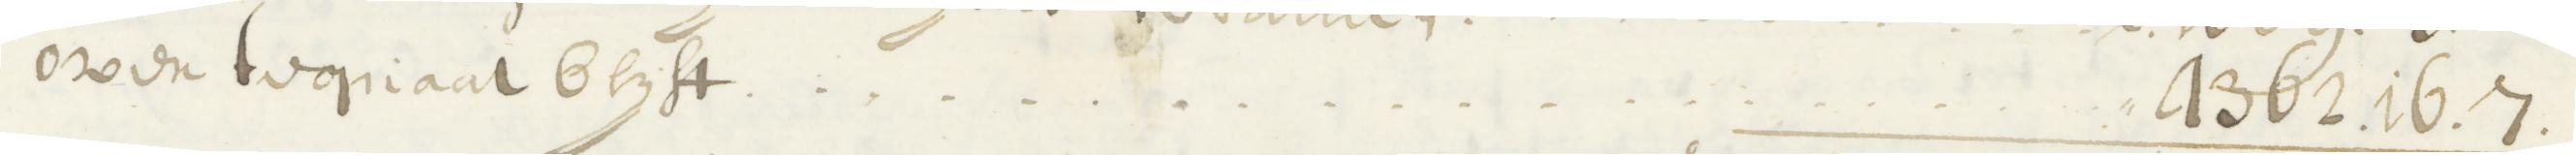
over tequaat blyft - - - - - - - - - - - - - - - - - - - - „ 4362.16. 7.
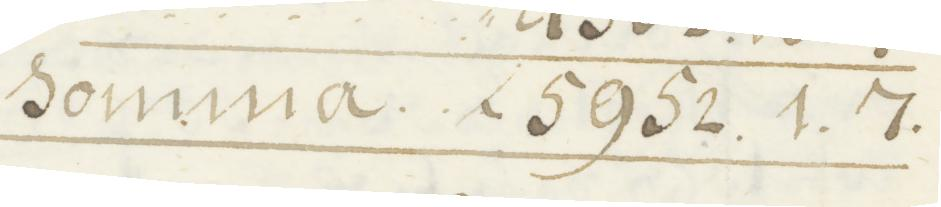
Somma ƒ 5952. 1. 7.
